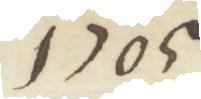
1705
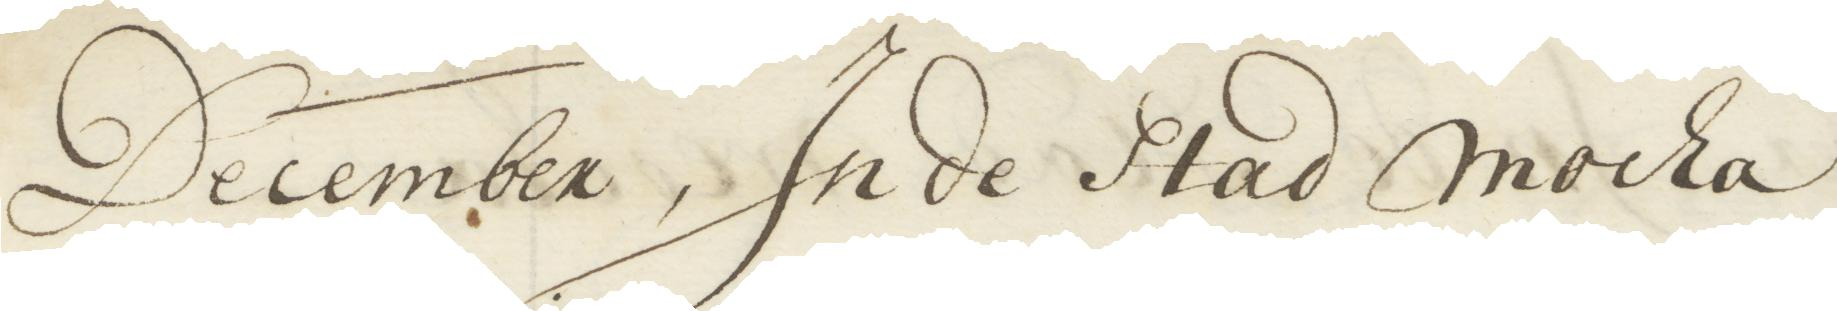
December, Jn de stad mocha
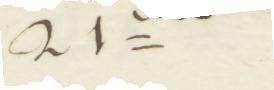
21=en
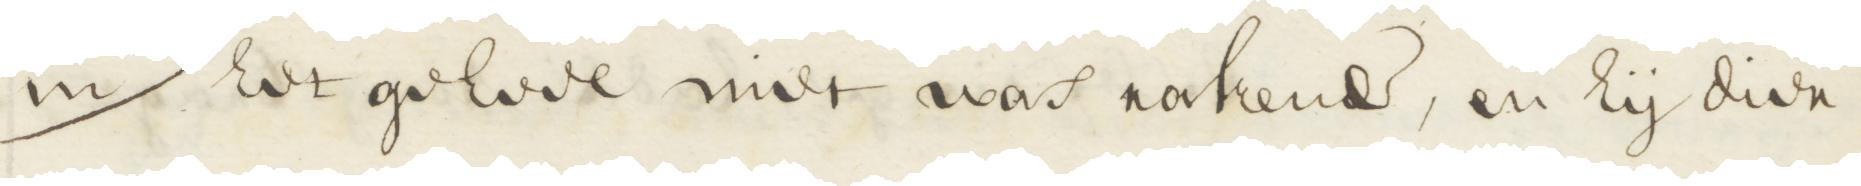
in het geheel niet was rakende, en hij dier
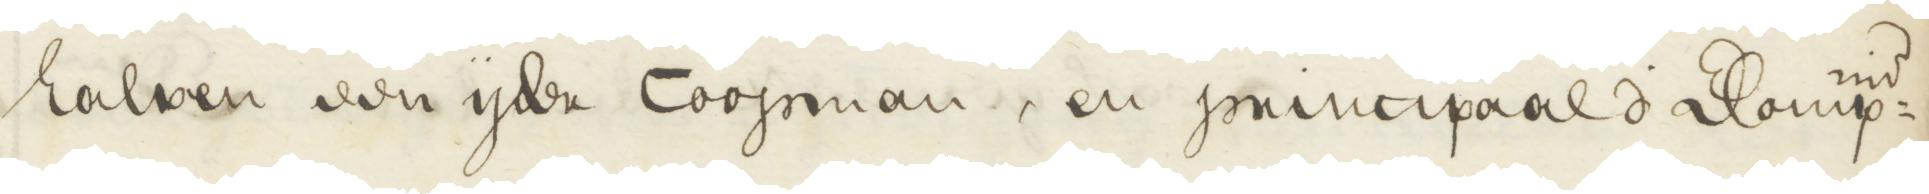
halven een ijder coopman, en principaal d' EComp=nie
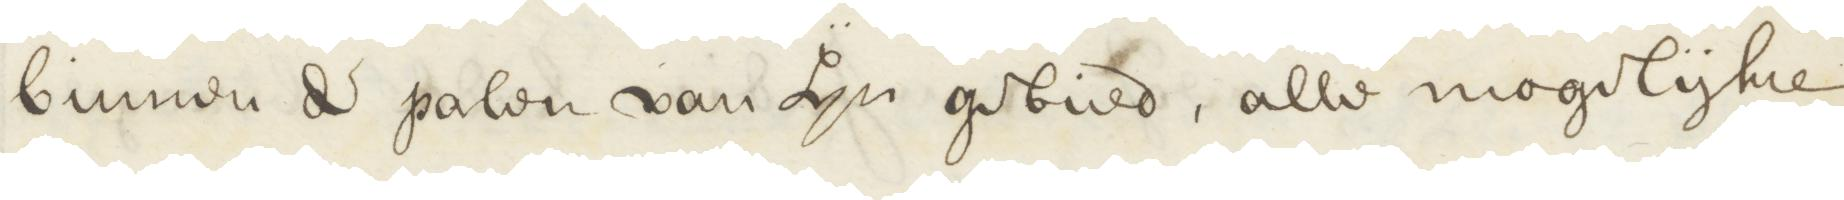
binnen de palen van sijn gebied, alle mogelijke
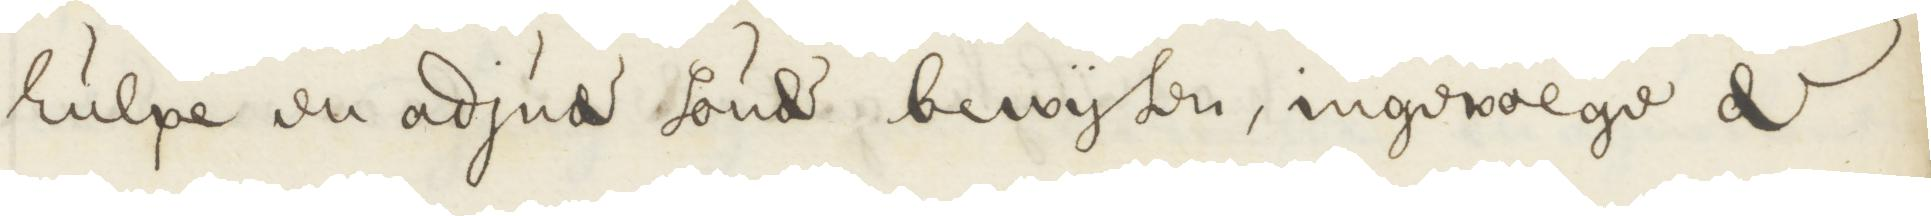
hulpe en adjude soude bewijsen, ingevolge de
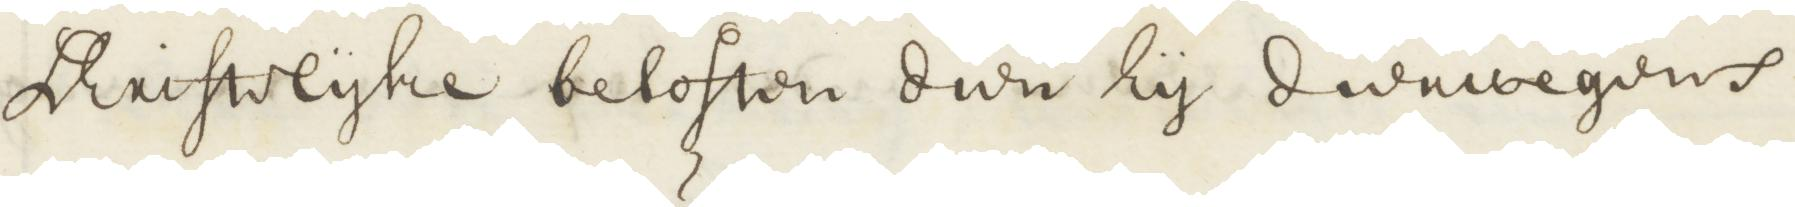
schriftelijke beloften dien hij dierwegens
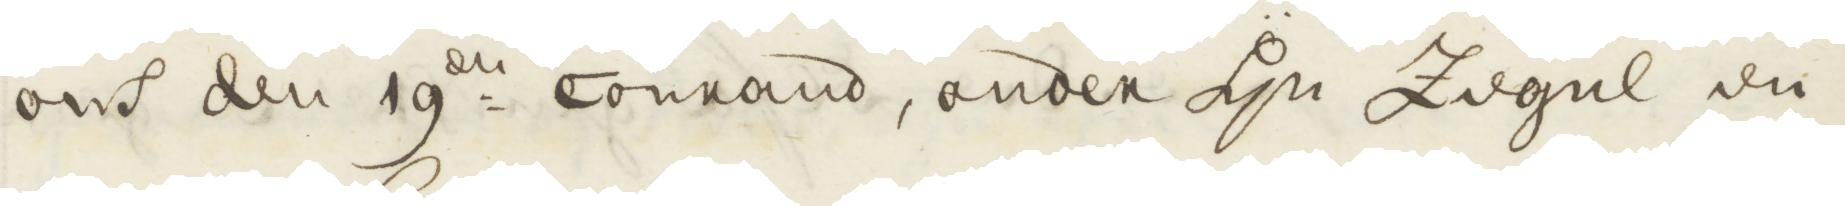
ons den 19=en courand, onder sijn zegul en
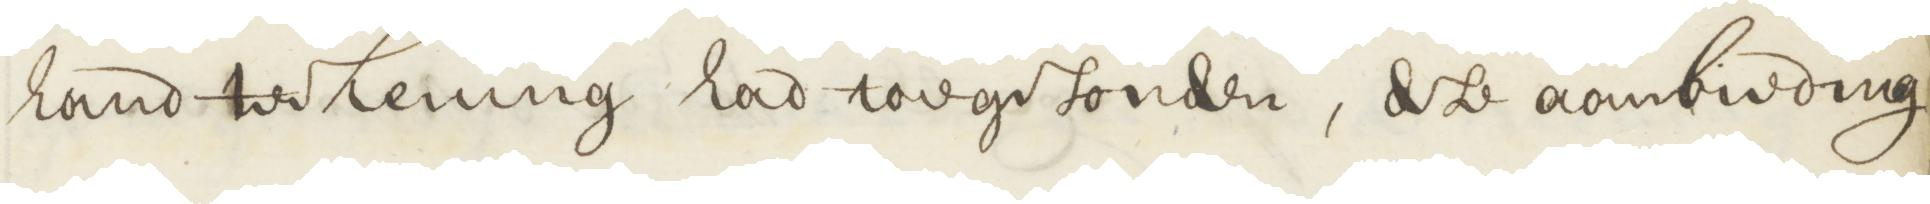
hand teekening had toegesonden, dese aanbieding
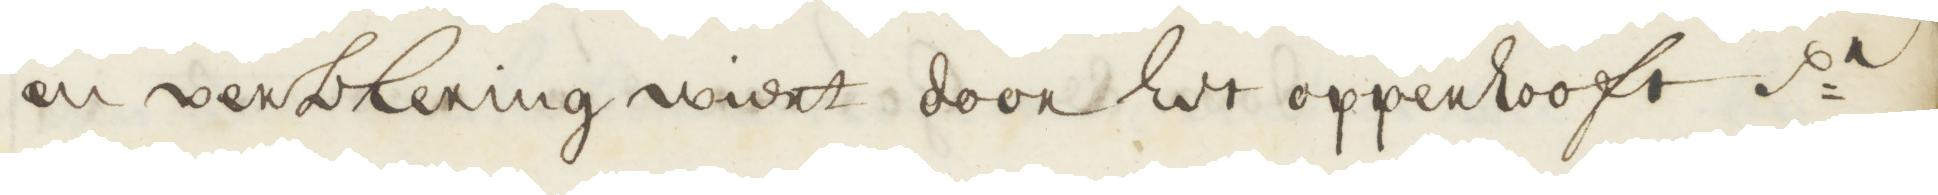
en versekering wiert door het opperhooft s=r
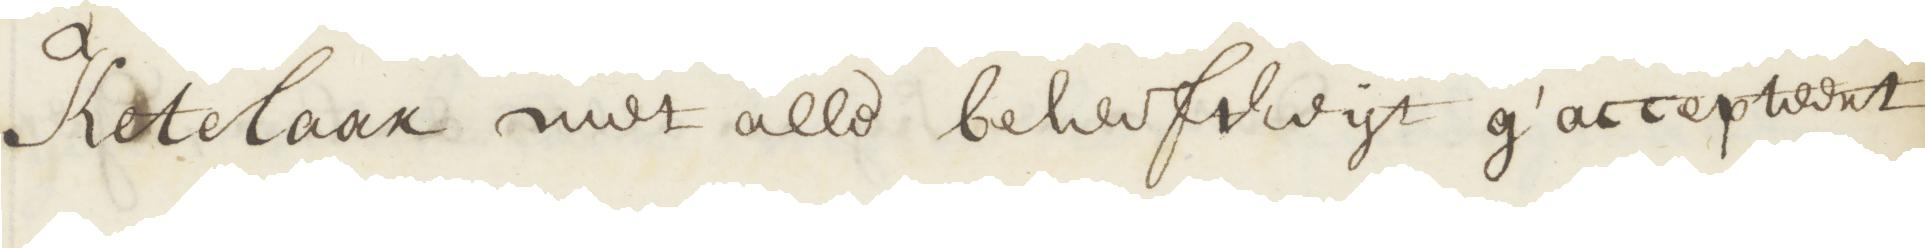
Ketelaar met alle beleeftheijt g’accepteert
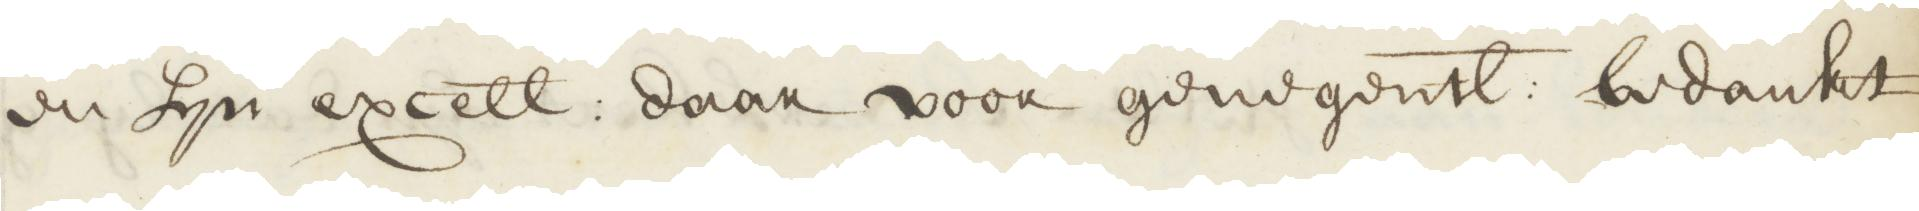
en sijn excell: daar voor genegentlijk bedankt
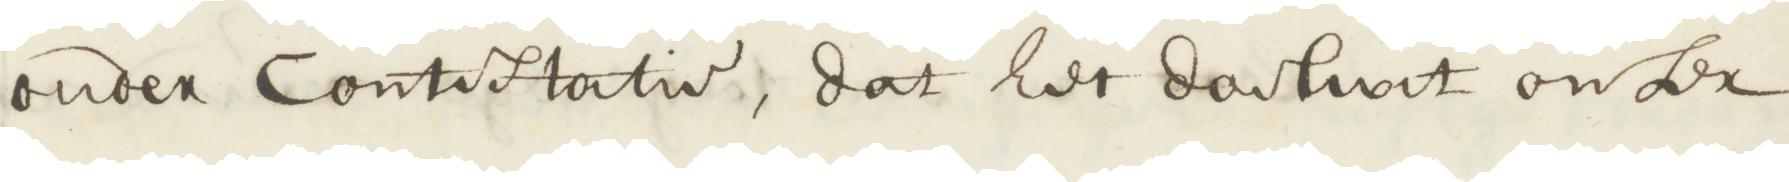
onder contestatie, dat het doelwit onser
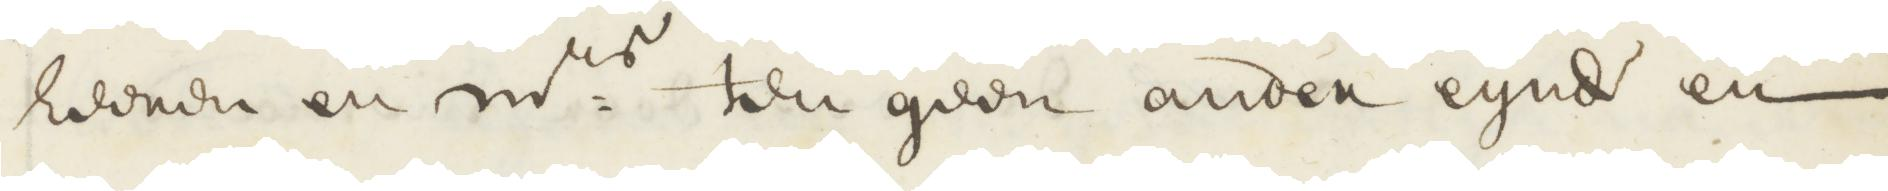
heeren en m=rs ten geen ander eijnde en
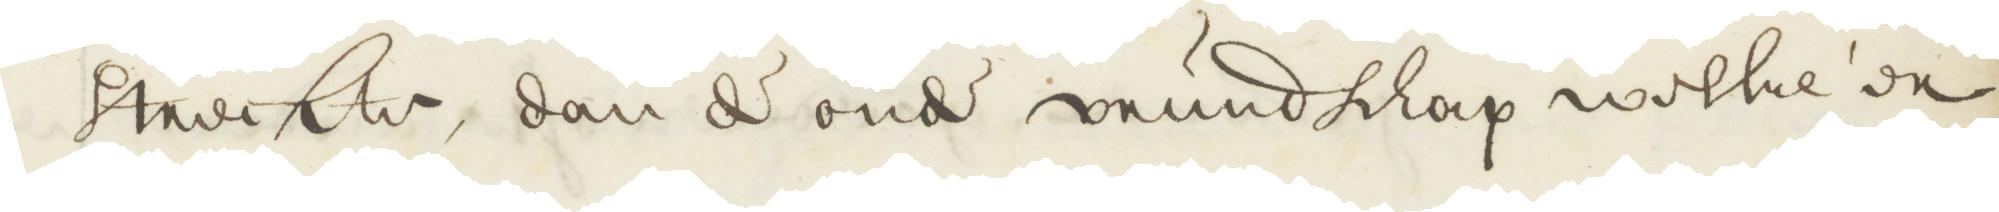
streckte, dan de oude vrundschap welke 'er
